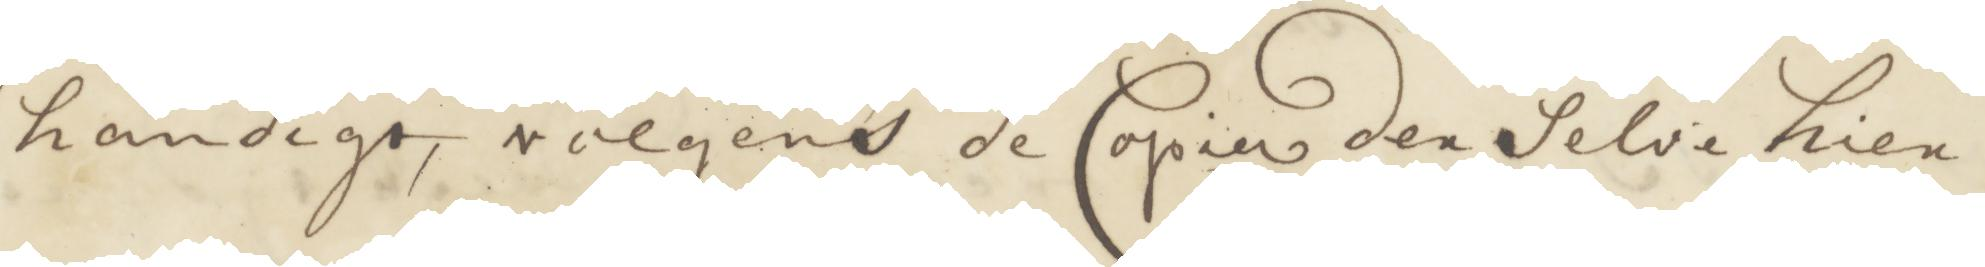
handigt, volgens de Copia der selve hier
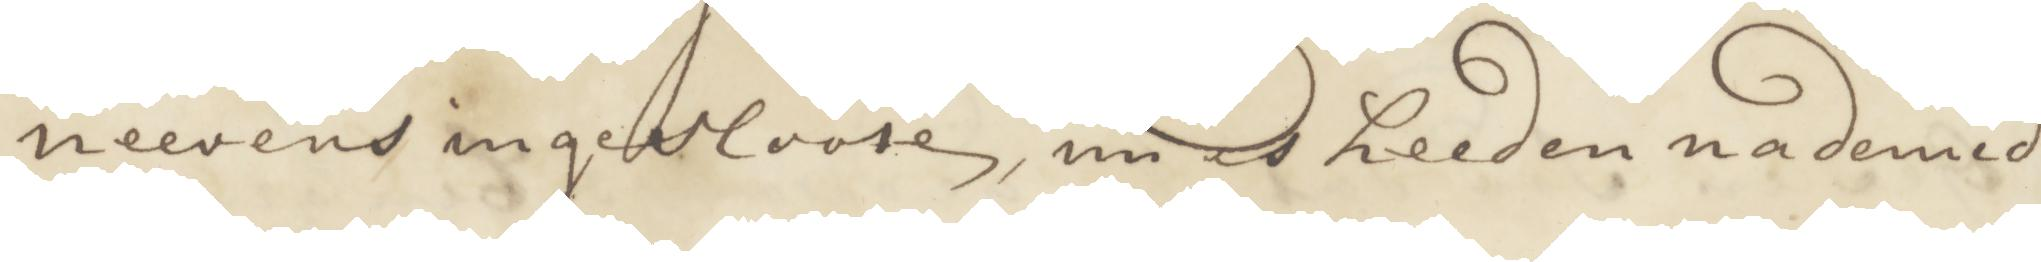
neevens ingeslooten, nu is heeden nademid
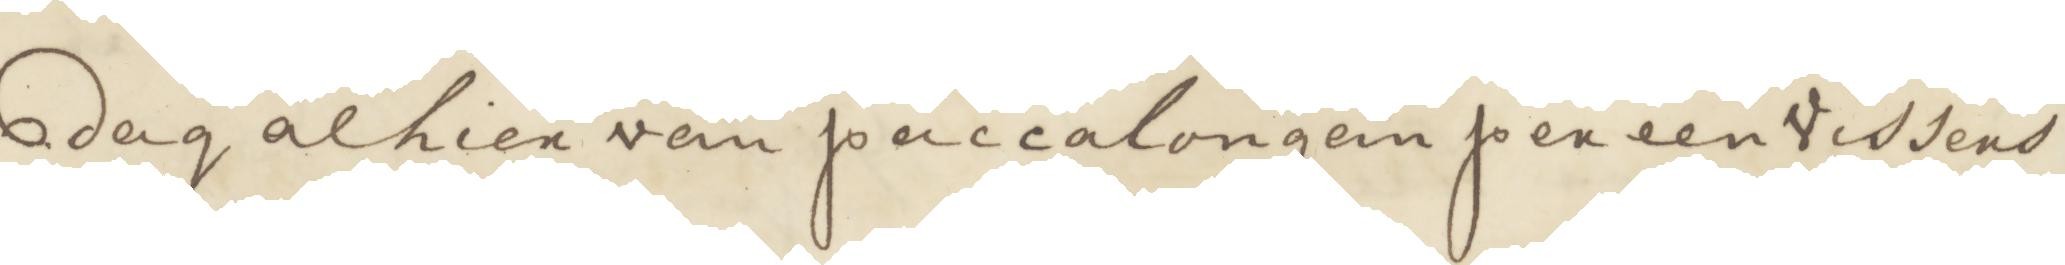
dag alhier van paccalongan per een vissers
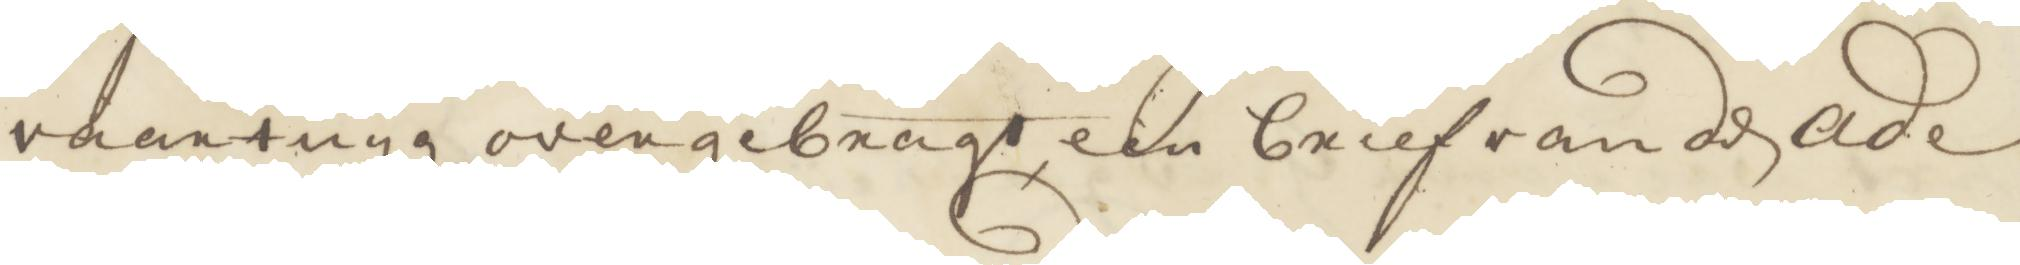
vaartuijg overgebragt, een brief van den Ade
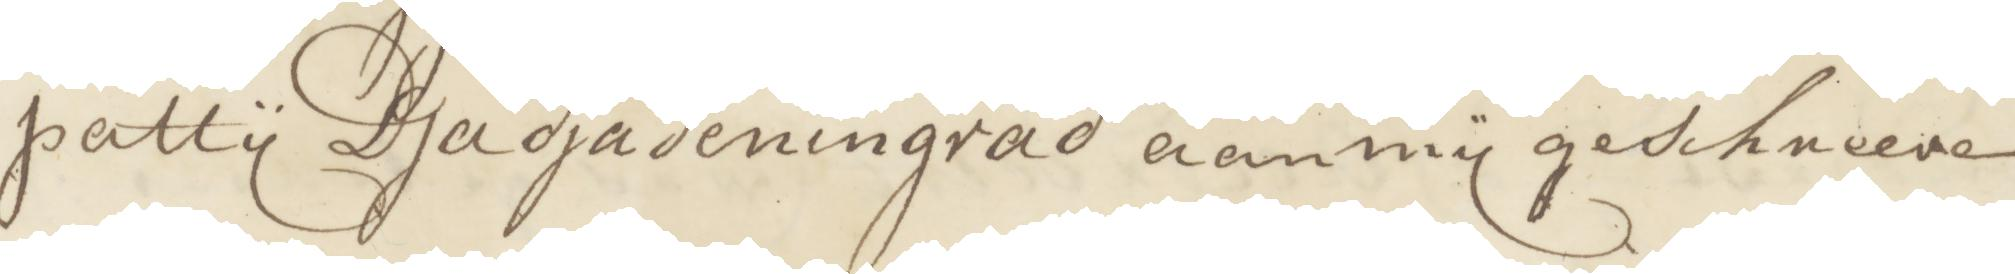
pattij Djadjadeningrad aan mij geschreeven
